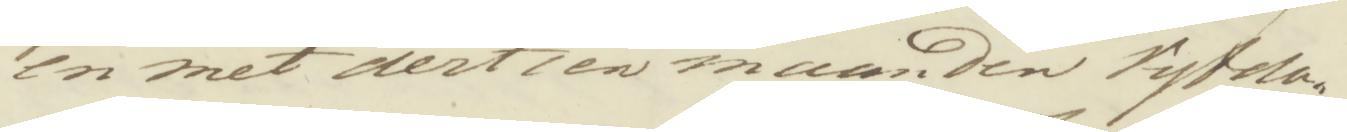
en met dertien maanden Vyf da„
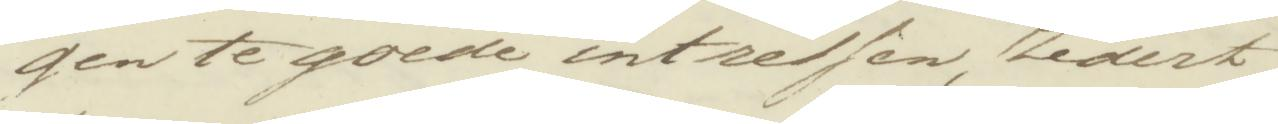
gen te goede intressen, zedert
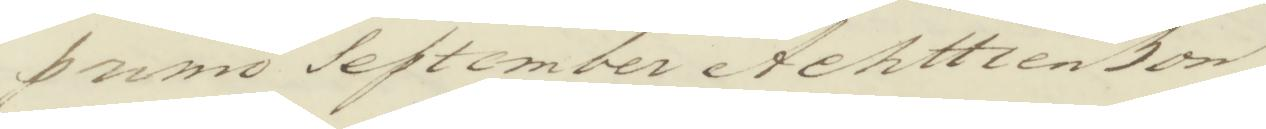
primo September Achttien hon
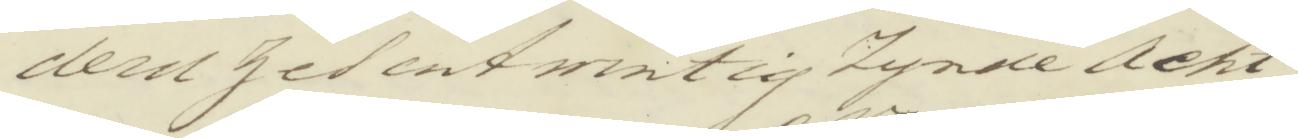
derd zes en twintig zynde Acht
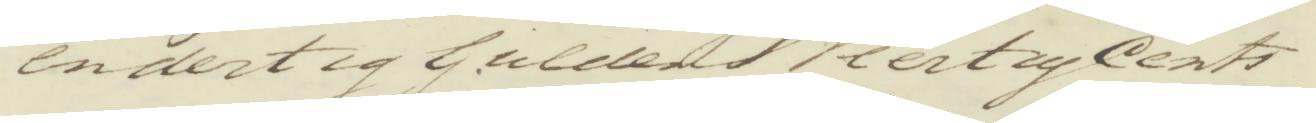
en dertig Guldens Veertig Cents
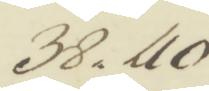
38„ 40
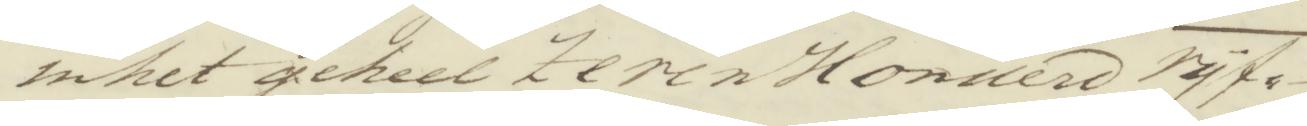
in het geheel zeven Honderd Vijf„
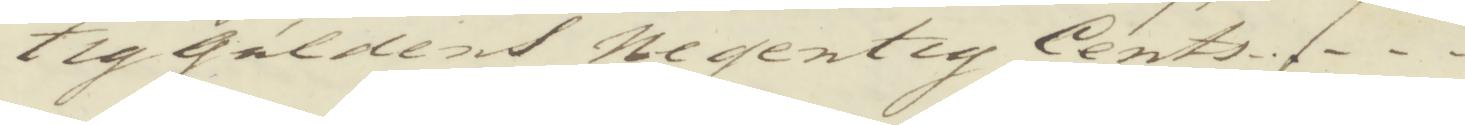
tig Guldens Negentig Cents - . ƒ - - -
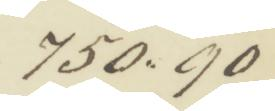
750„ 90
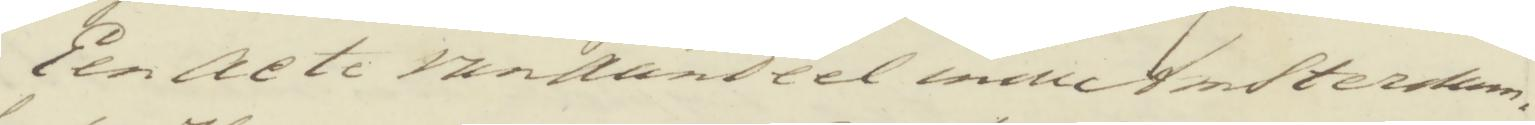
Een acte van aandeel in de Amsterdam
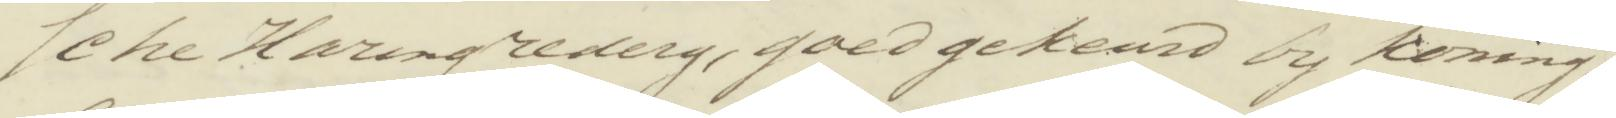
sche Haringredery, goed gekeurd by koning„
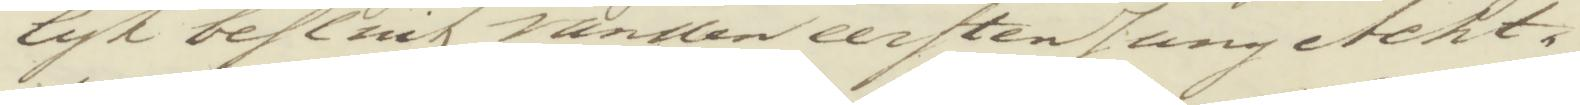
lyk besluit vanden eersten Juny Acht„
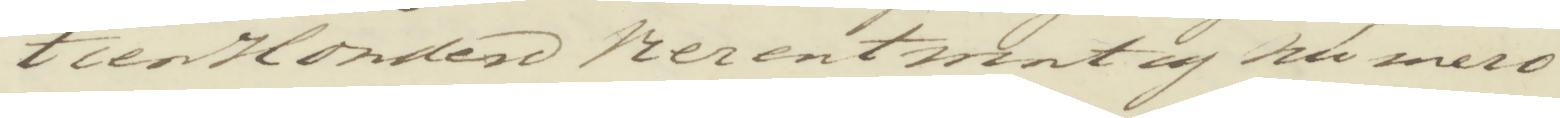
tien Honderd vier en twintig Numero
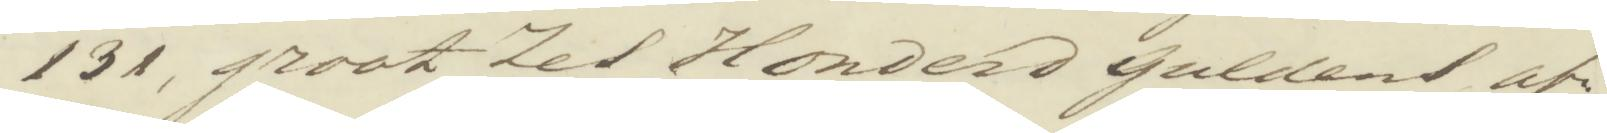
131, groot Zes Honderd Guldens, af
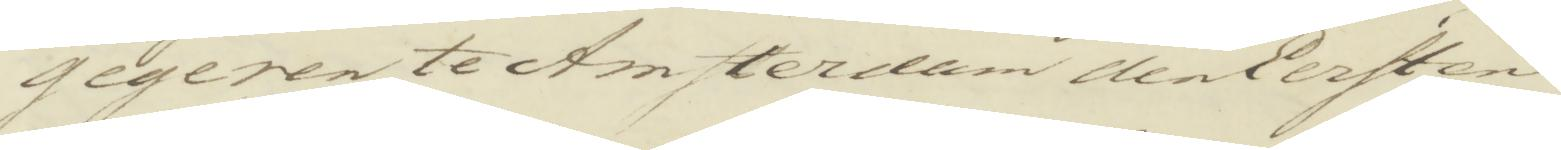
gegeven te Amsterdam den Eersten
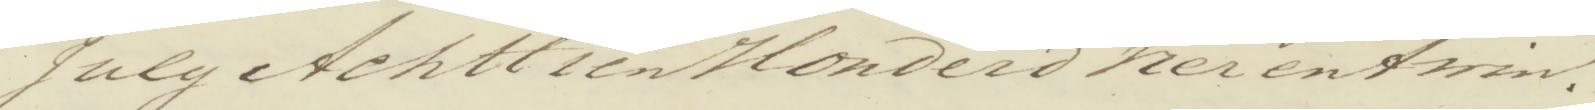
July Achttien Honderd vier en twin„
